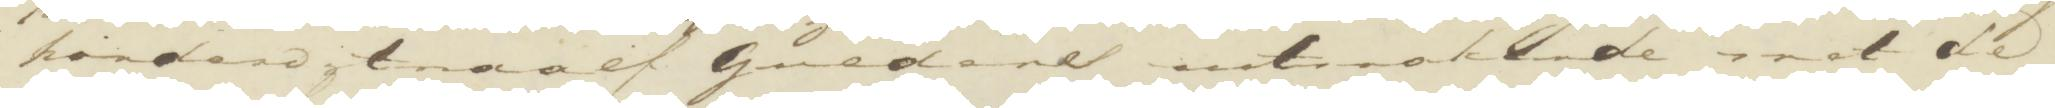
honderdentwaalf Guldens uitmakende met de
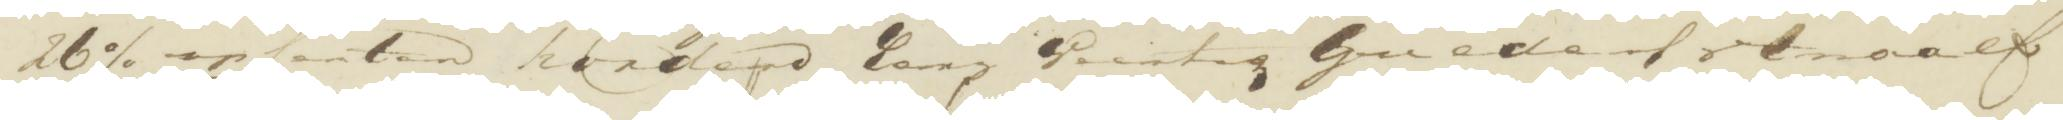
26% opCenten honderd Eenen Veertig Guldens & twaalf
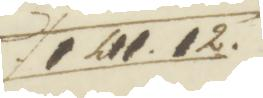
ƒ141.12.
